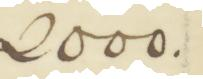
2000.
